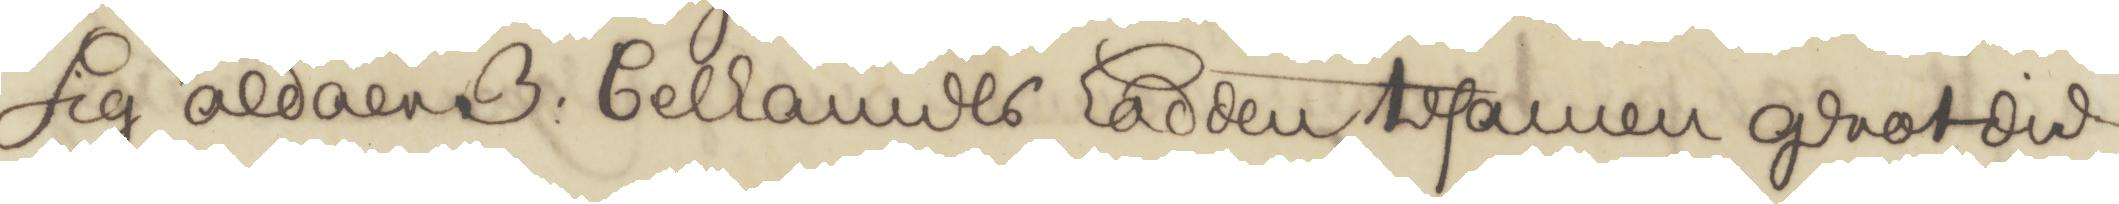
sig aldaer 3: belhamels hadden tesamen gerot die
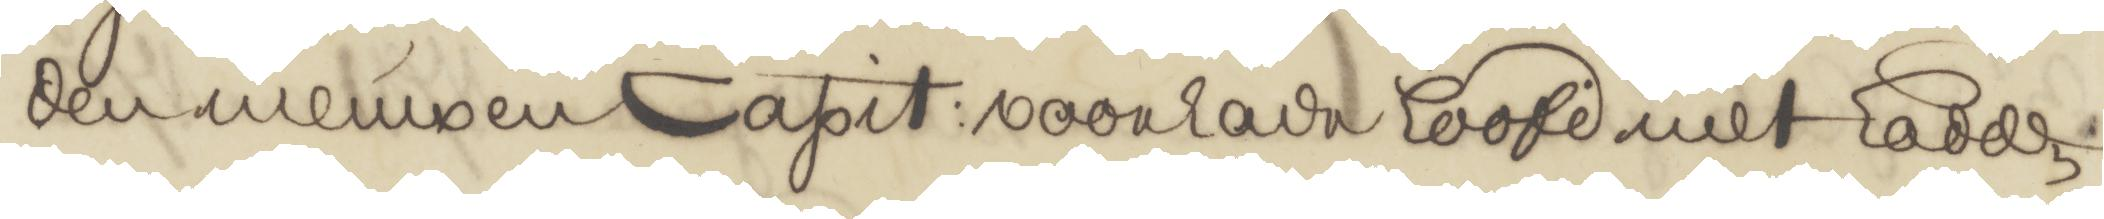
den nieuwen Capit: voor haer hoofd niet hadden
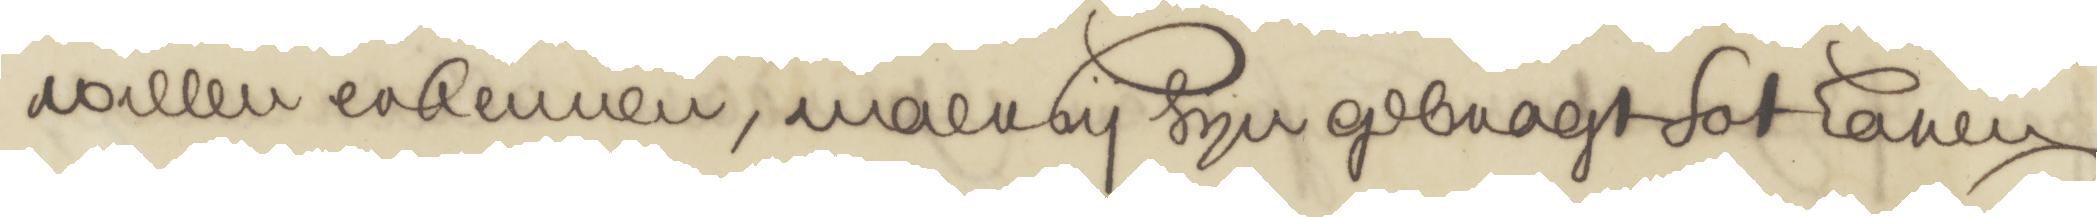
willen erkennen, maer bij sijn gebragt tot haren
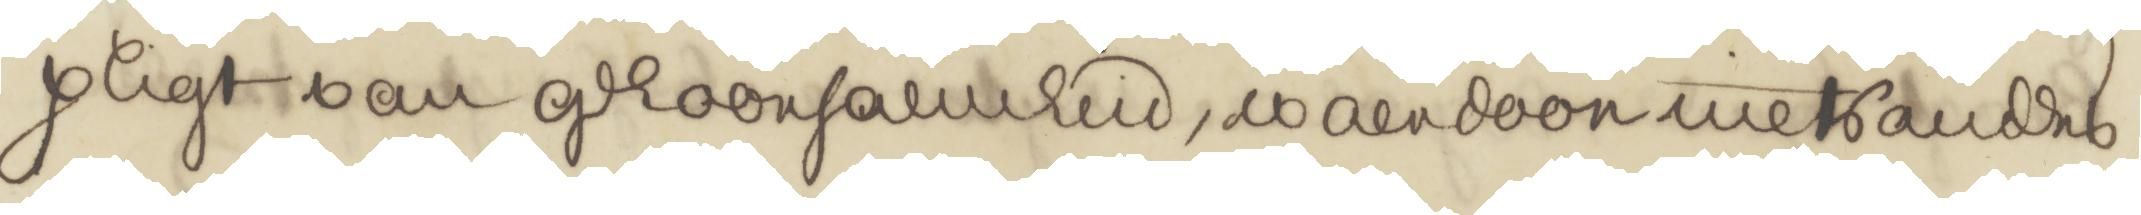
pligt van gehoorsaemheid, waerdoor niets anders
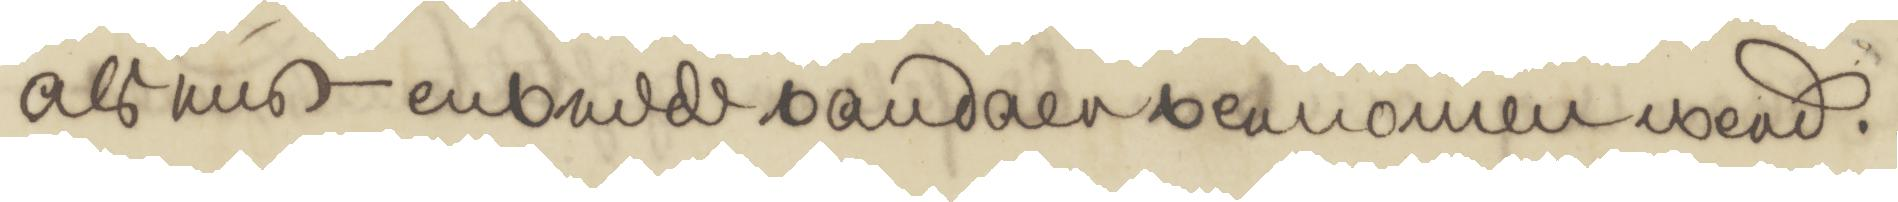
als rust en vrede van daer vernomen werd.
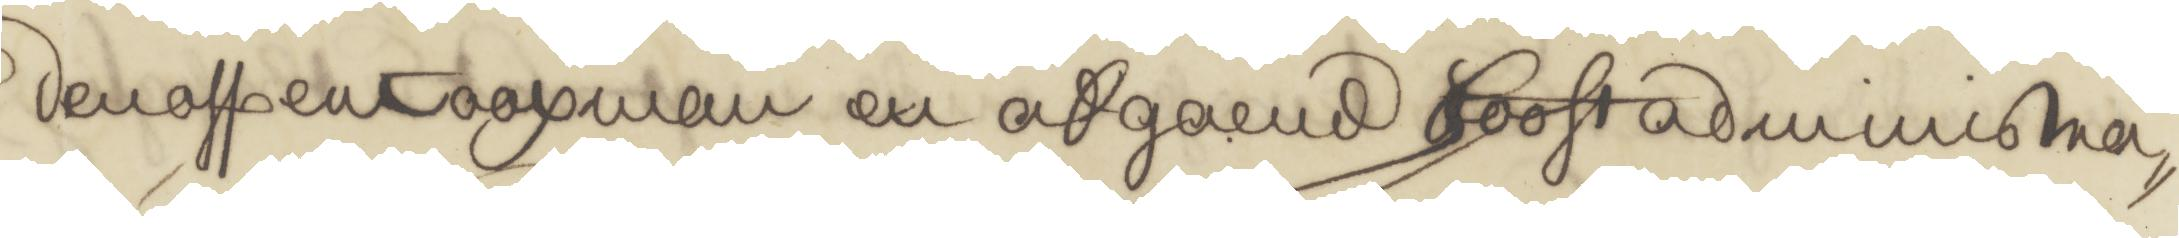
den oppercoopman en afgaend hooft administra„
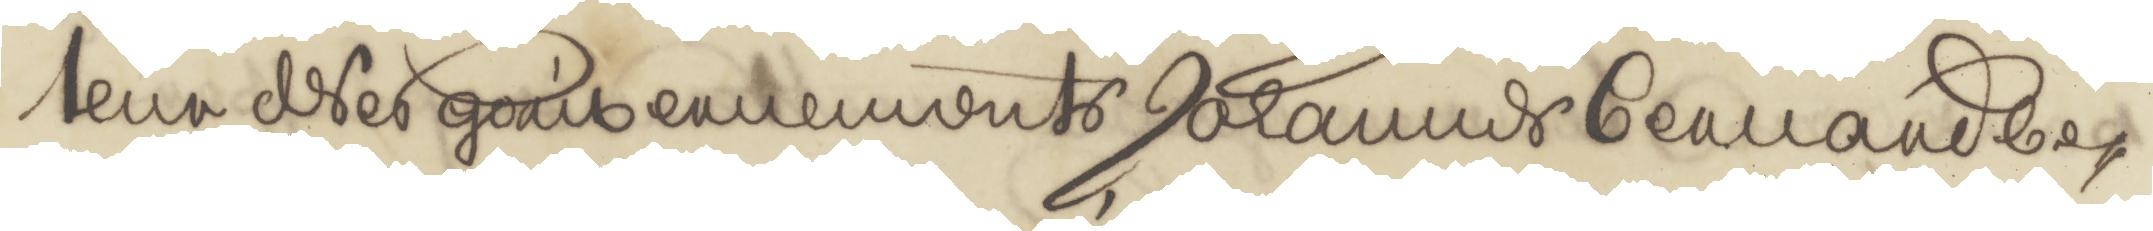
teur deses gouvernements johannes bernard be„
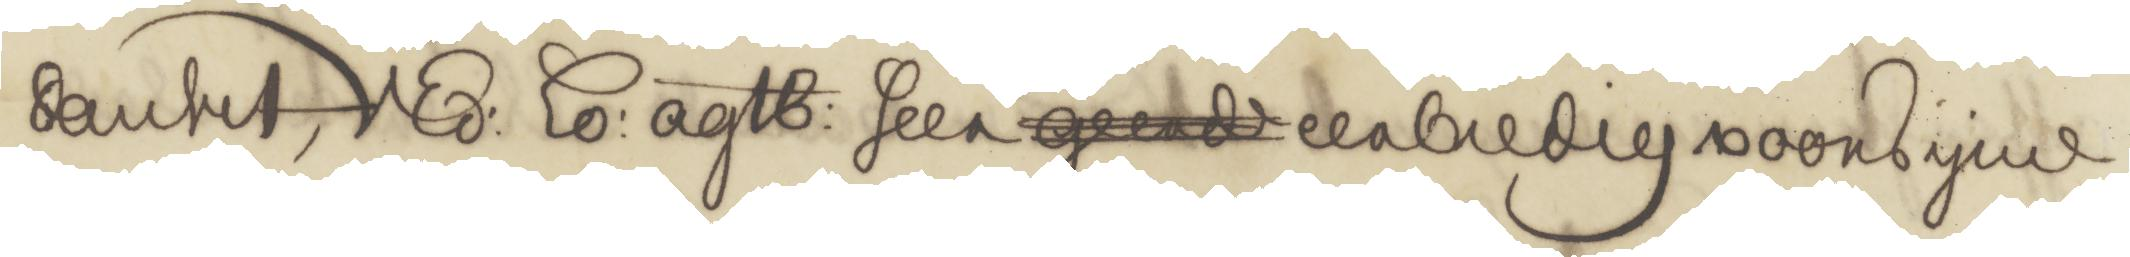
dankt, UEd: ho: agtb: seer g'eerde eerbiedig voorsijne
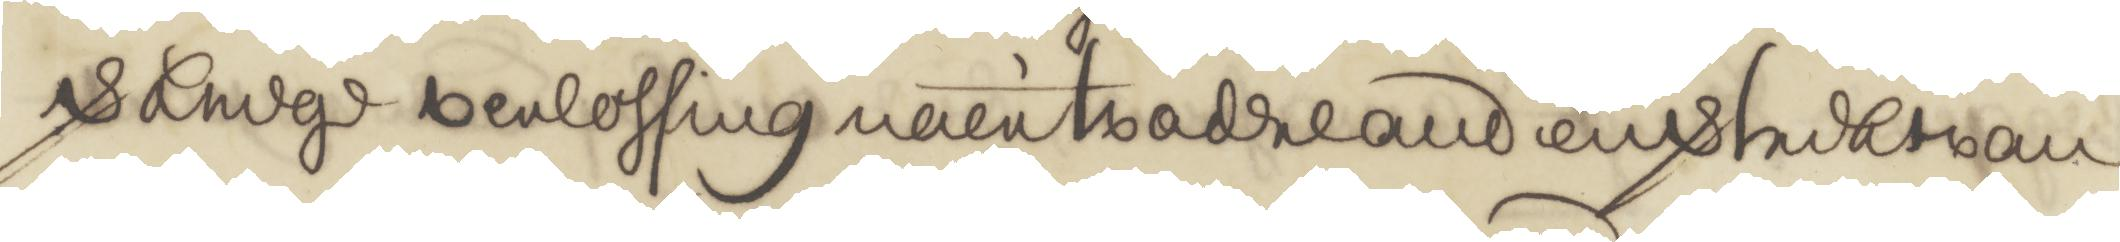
verkrege verlossing naer 'tvaderland en vertrekt van
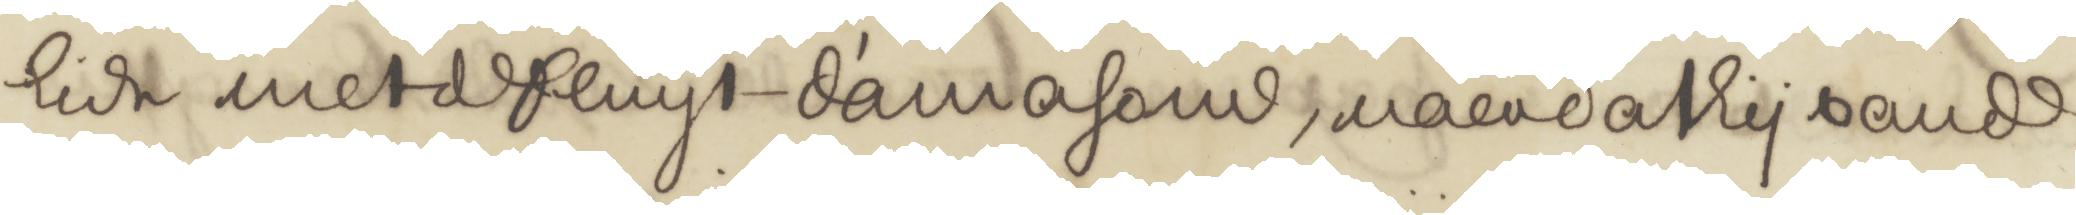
hier met de fluijt d'amasone, naer dat hij van de
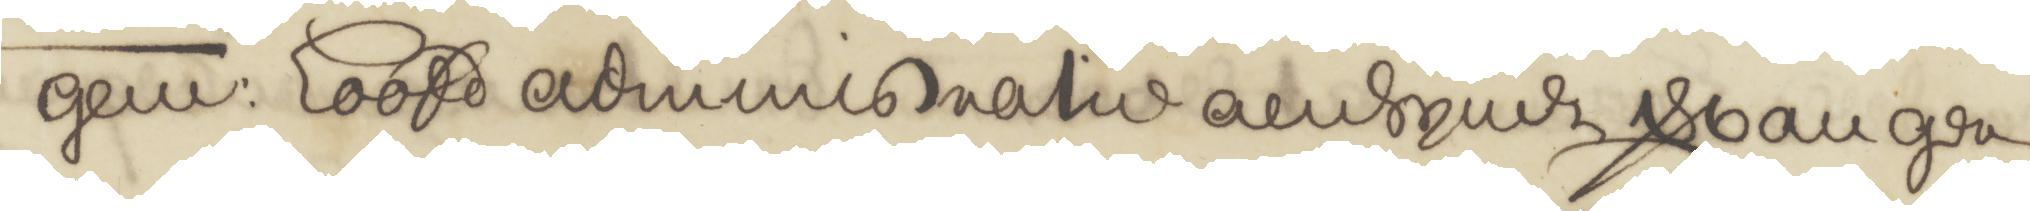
gem: hoofd administratie aen sijner vervanger
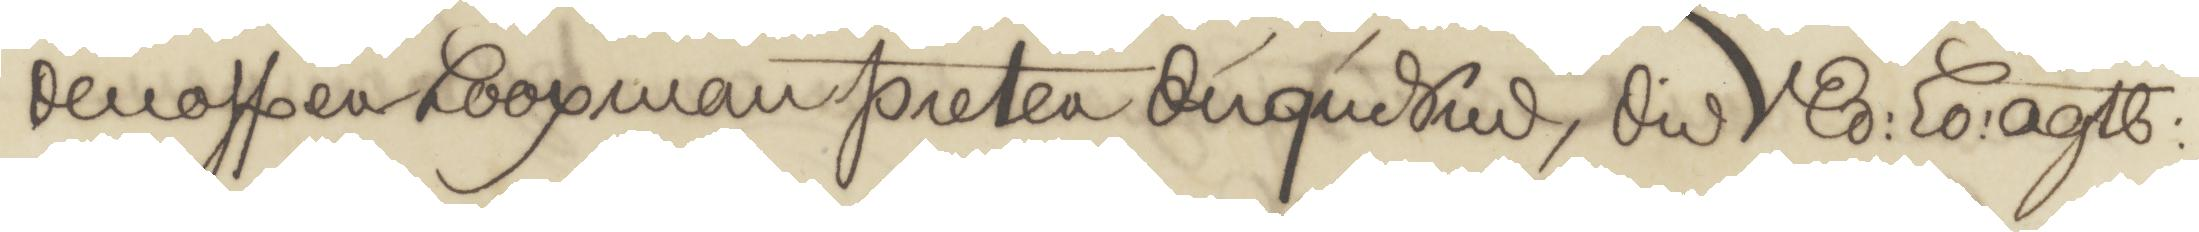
den opper koopman pieter du quesne, die UEd: ho: agtb:
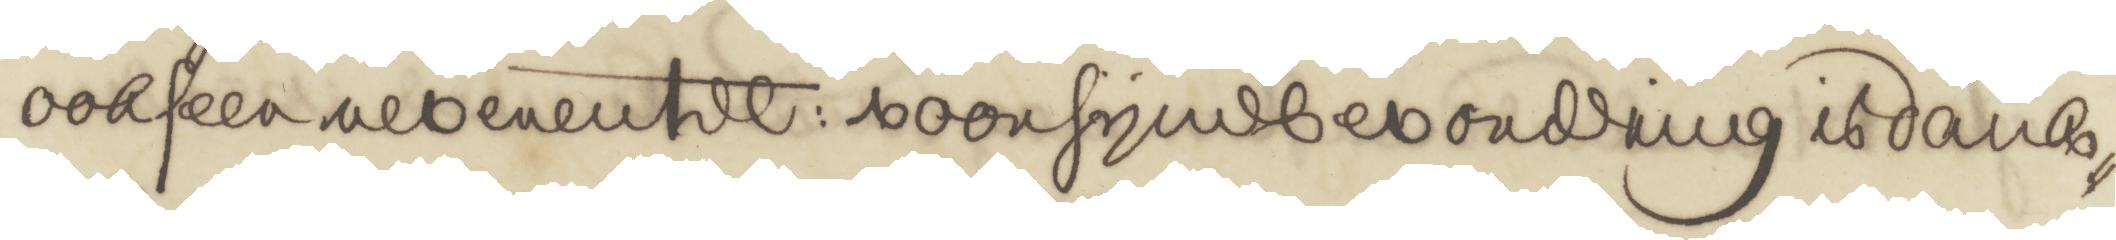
ook seer reverentelijk voor sijne bevordering is dank„
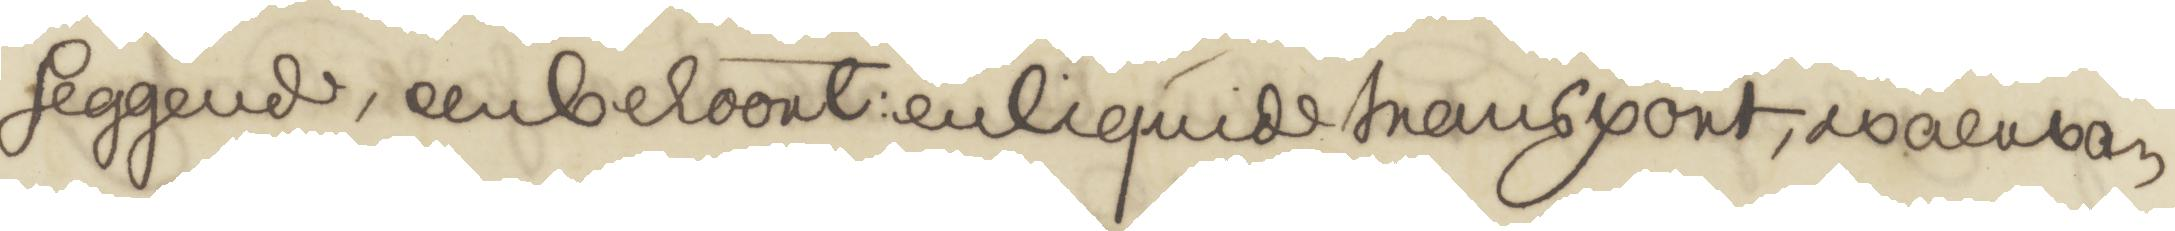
seggende, een behoorlijk en liquide transport, waervan
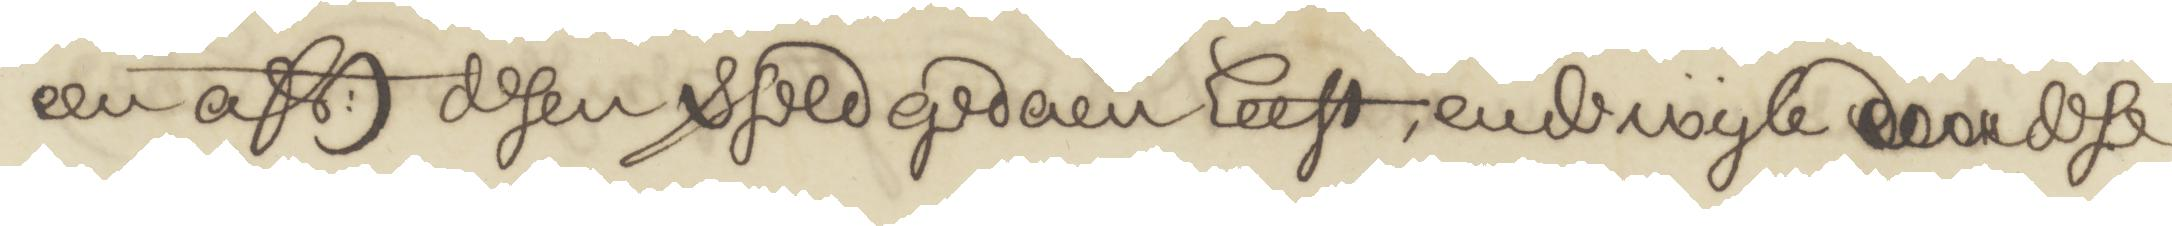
een afs: desen verseld gedaen heeft, ende wijle door dese
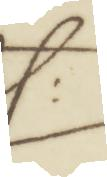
vers:
